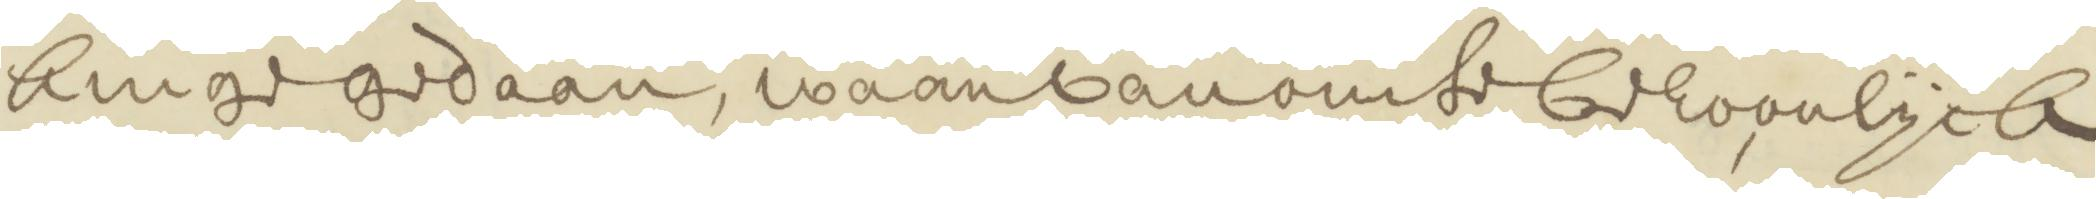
kinge gedaan, waar van om se behoorlijck
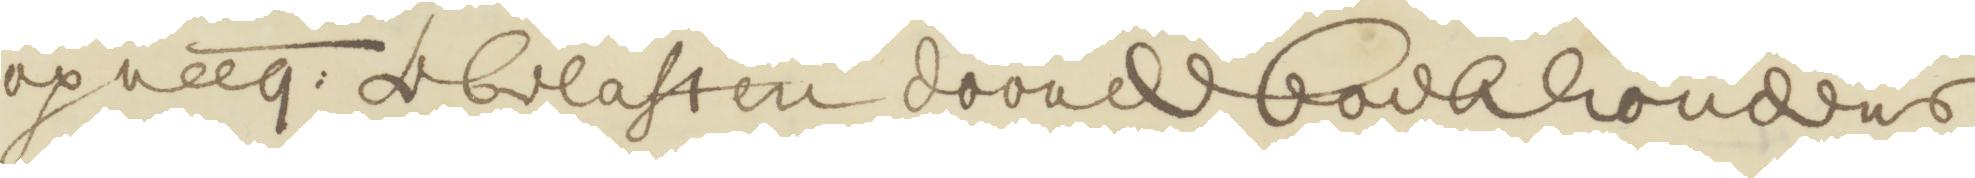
op reeq: te belasten door de boekhouders
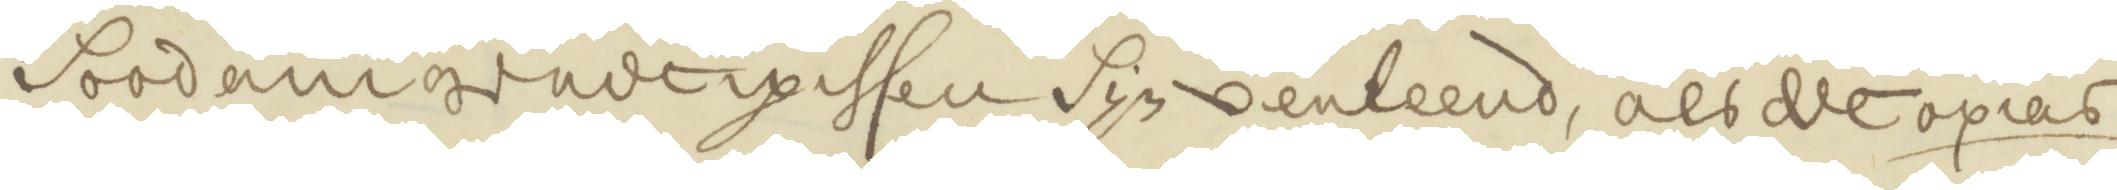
Soodanige recipissen sijn verleend, als de Copias
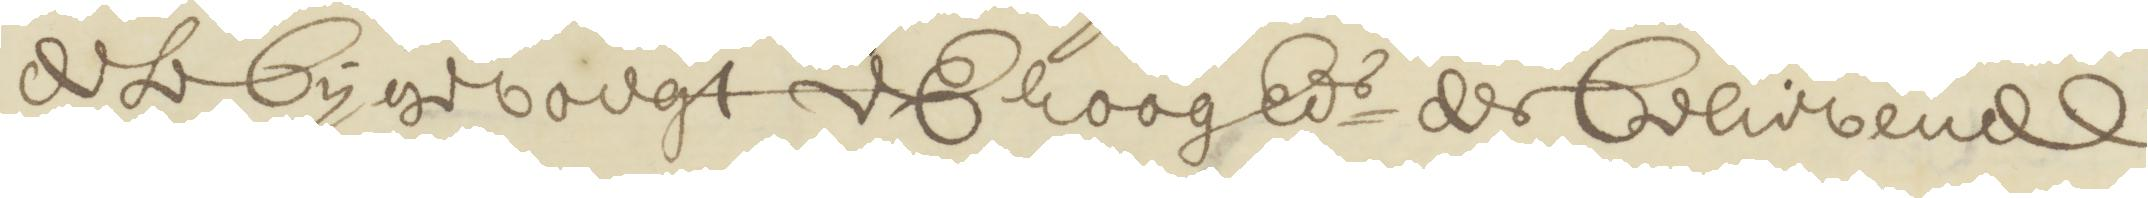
dese bij gevoegt vE hoog Ed=s des believende
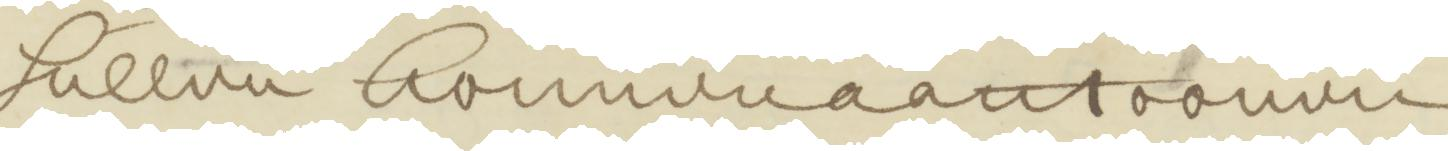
sullen konnen aantoonen
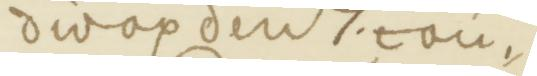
die op den 7. cou„
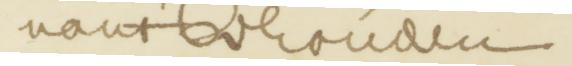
,rant behouden
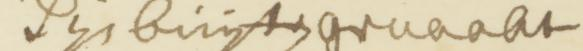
sijn buijten geraakt
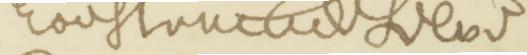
hoe stercke selve
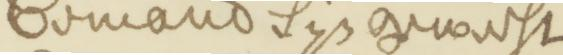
bemand sijn geweest
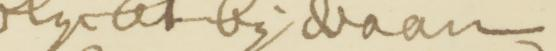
blijckt bij de aan
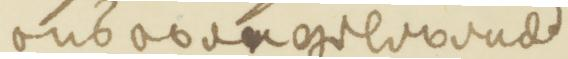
ons overgeleverde
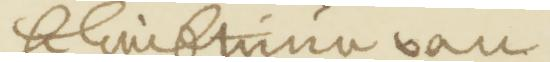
schriftuur van
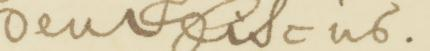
den E fiscus.
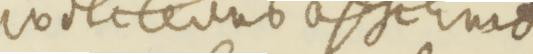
welckers afschrif
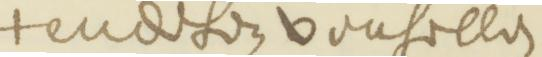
ten desen versellen
